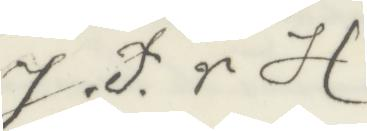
J.F. v H
